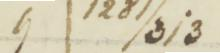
9 1281/313
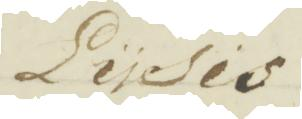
Lijsis
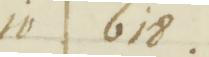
10 618.
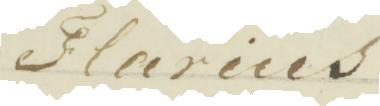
Flavius
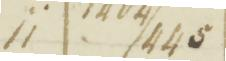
11 1404/445
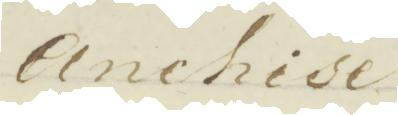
Anchise
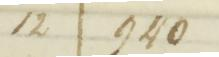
12 940
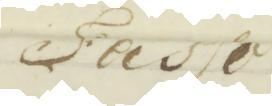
Fasso
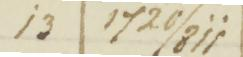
13 1720/811
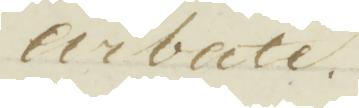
Arbate,
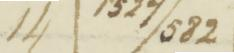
14 1527/582
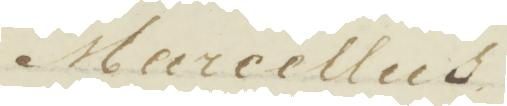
Marcellus,
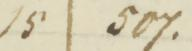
15 507.
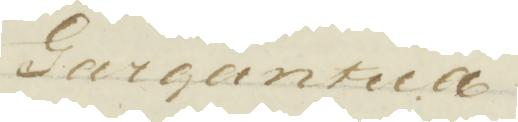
Gargantua
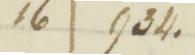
16 934.
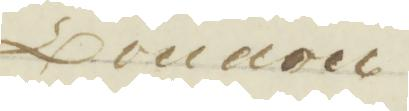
Loudou
